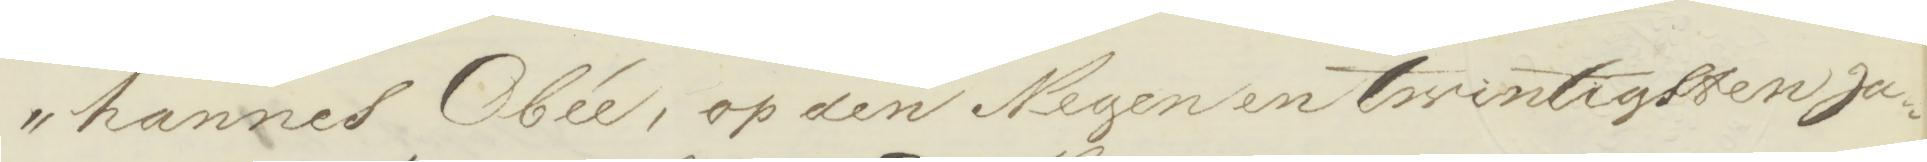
„hannes Obée, op den Negen en twintigsten Ja„
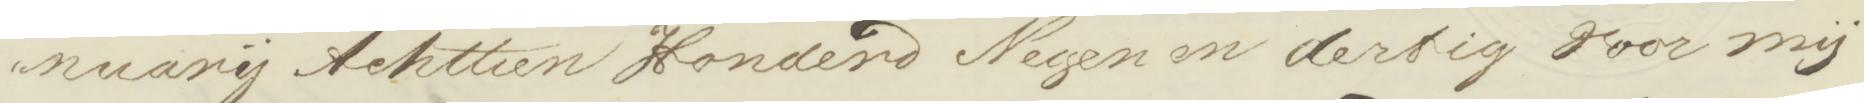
„nuarij Achttien Honderd Negen en dertig voor mij
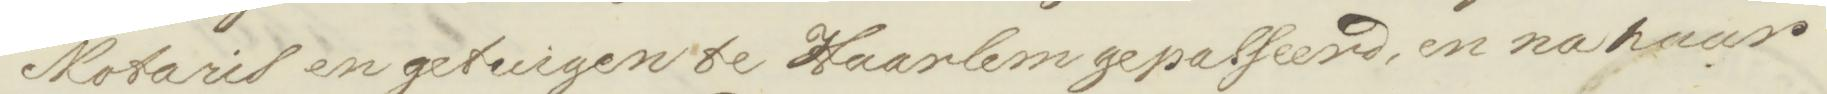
Notaris en getuigen te Haarlem gepasseerd, en na haar
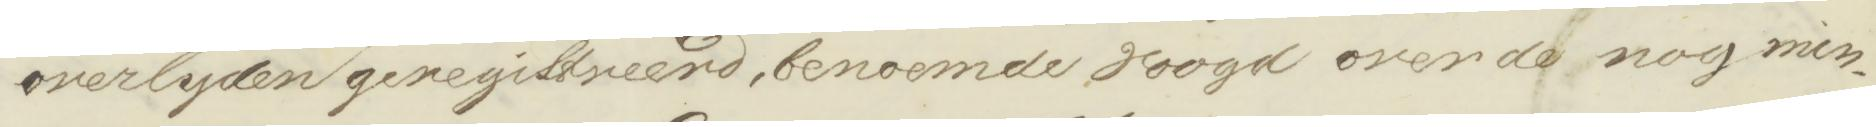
overlyden geregistreerd, benoemde Voogd over de nog min
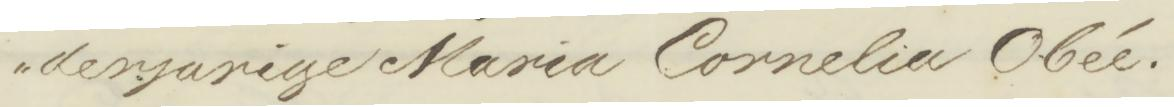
„derjarige Maria Cornelia Obée.
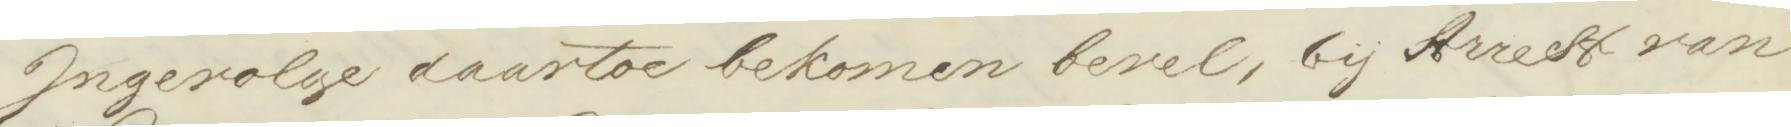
Ingevolge daartoe bekomen bevel, bij Arrest van
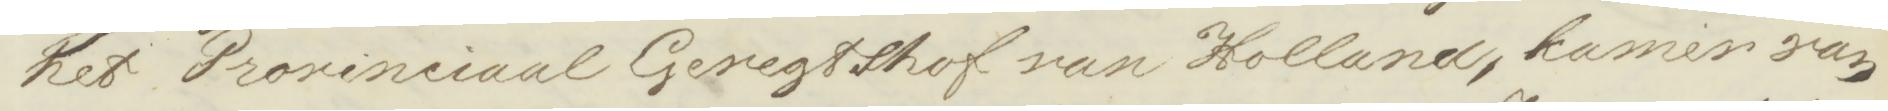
het Provinciaal Geregtshof van Holland, kamer van
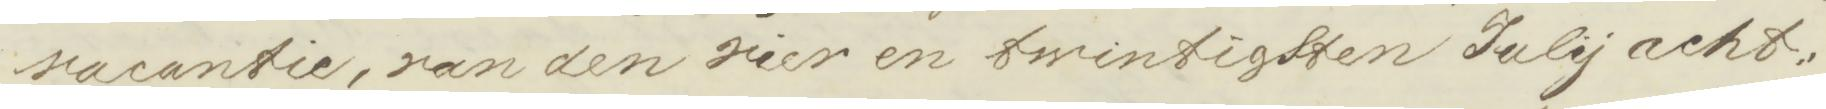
vacantie, van den vier en twintigsten Iulij acht„
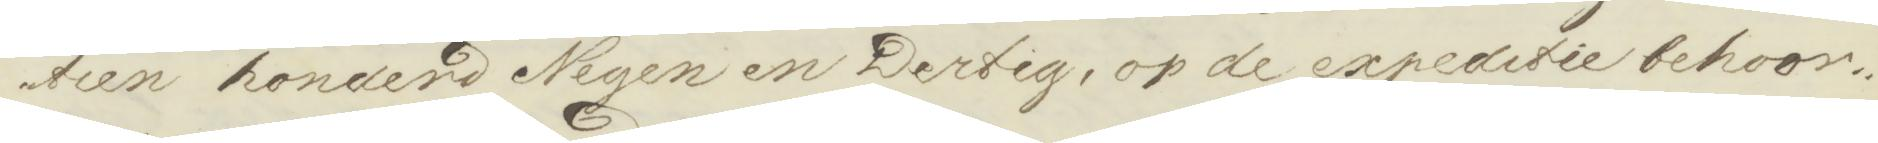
„tien honderd Negen en Dertig, op de expeditie behoor„
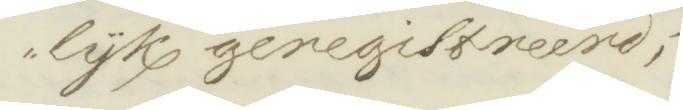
„lijk geregistreerd;
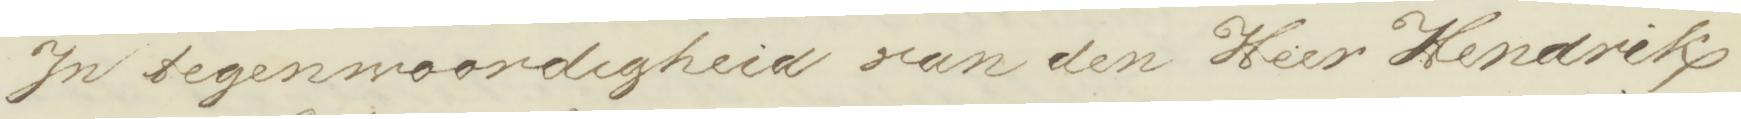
Jn tegenwoordigheid van den Heer Hendrik
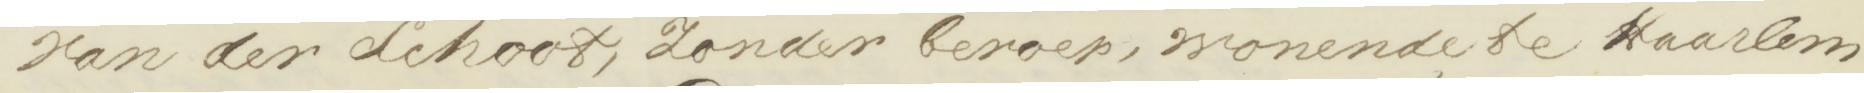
van der Schoot, zonder beroep, wonende de Haarlem
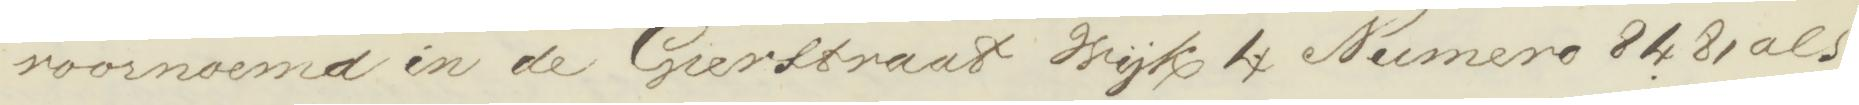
voornoemd in de Gierstraat Wijk 4 Numero 848, als
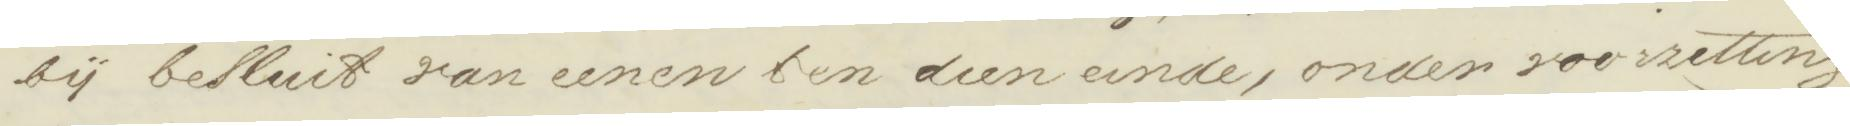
bij besluit van eenen ten dien einde, onder voorzetting
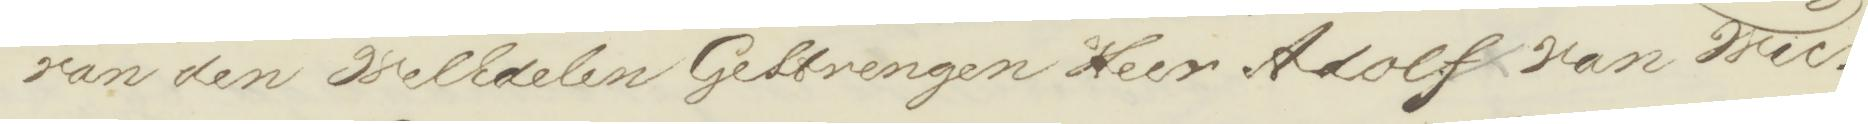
van den WelEdelen Gestrengen Heer Adolf van Wic,
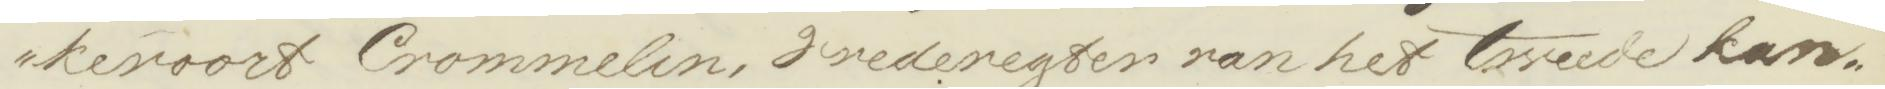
„kevoort Crommelin, Vrederegter van het Tweede kan„
